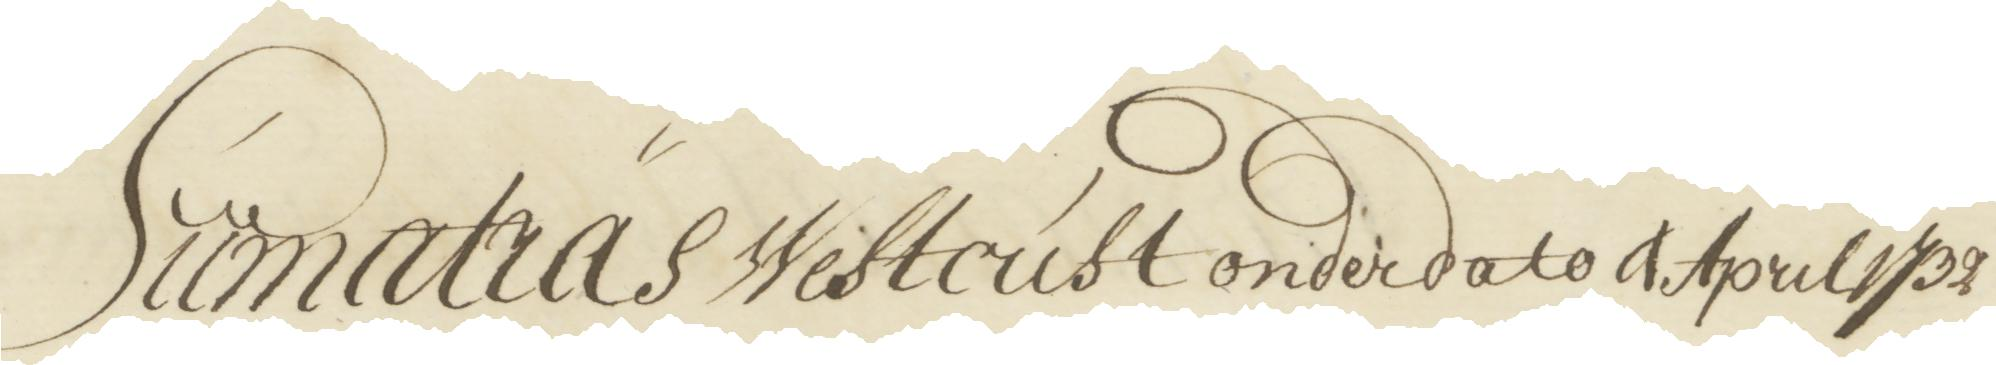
Sumatras Westcust onder dato 4 April 1732
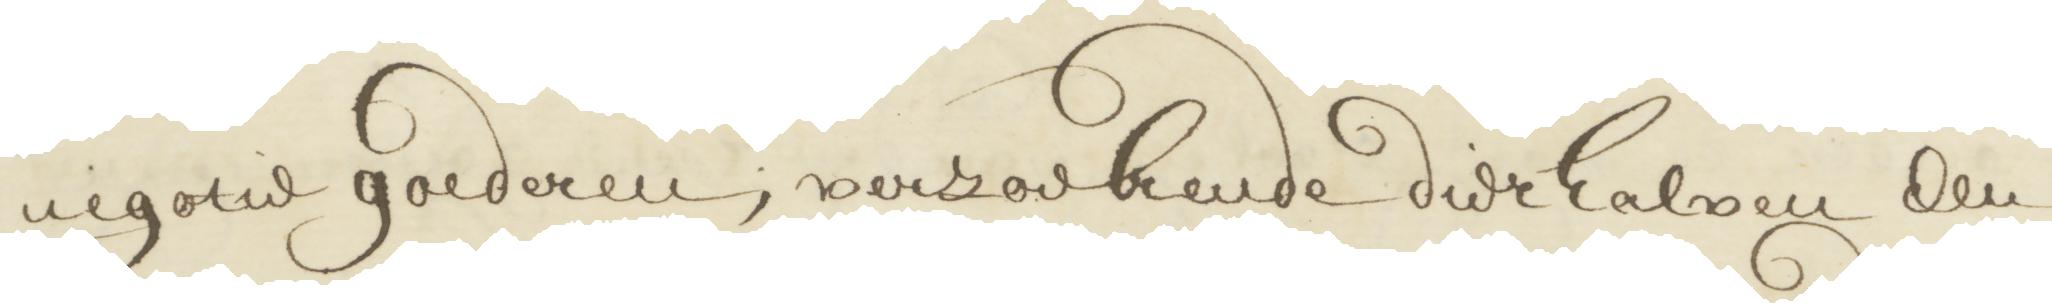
negotie goederen; verzoekende dierhalven den
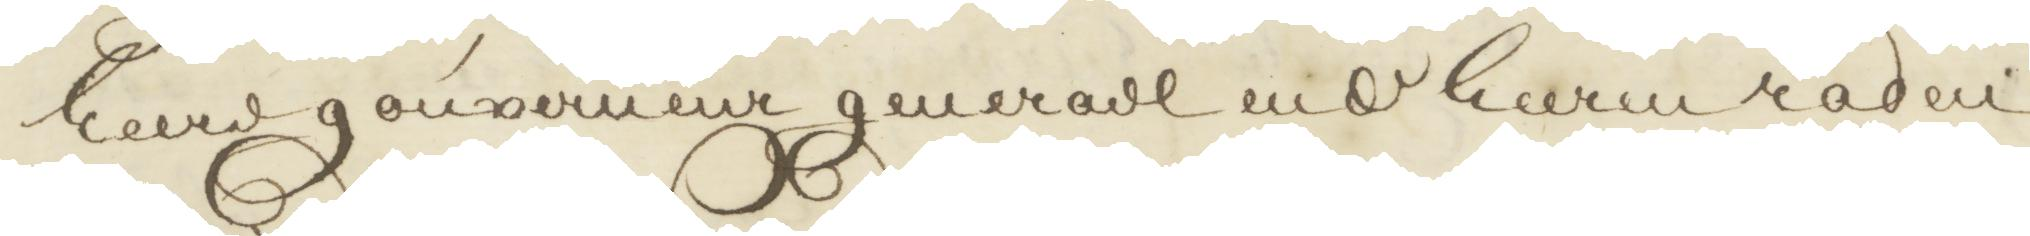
heere gouverneur generael en de heeren raden
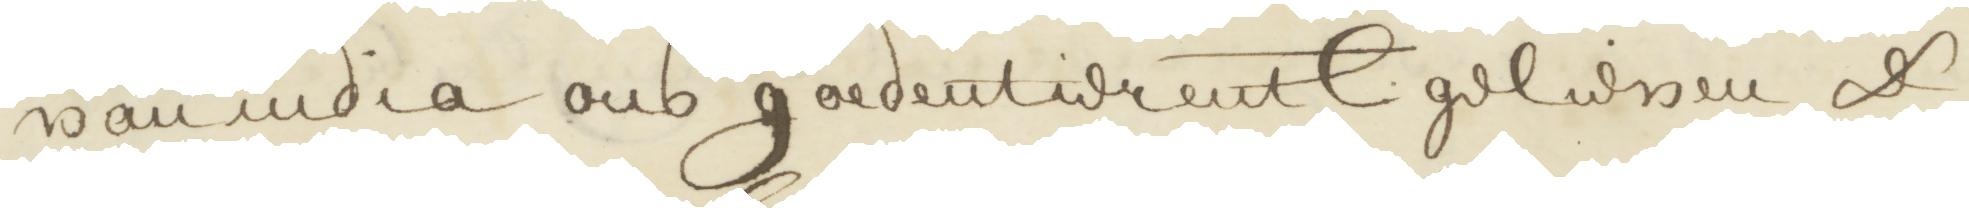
van india ons goedertierenth: gelieven te
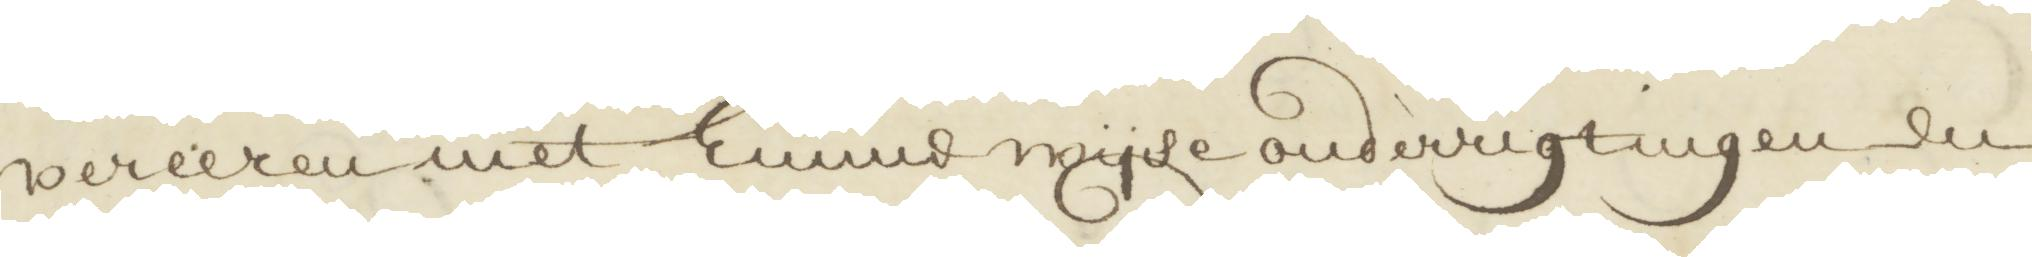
vereeren met hunne wijse onderrigtingen en
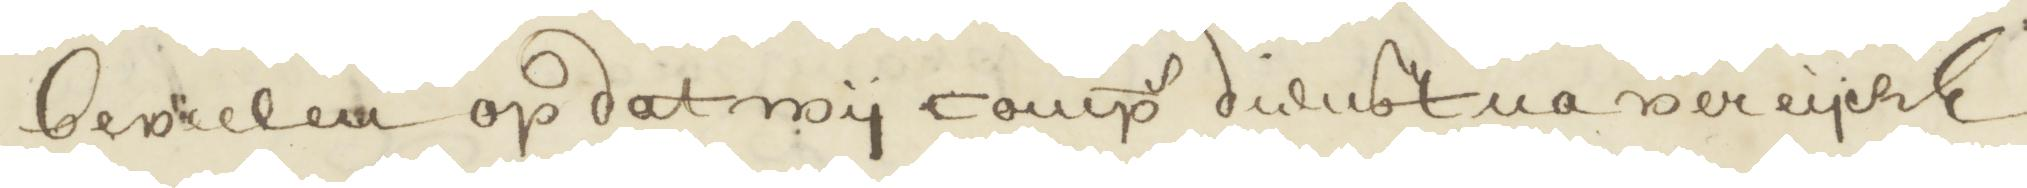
beveelen op dat wij comp.s dienst na ver eijsch
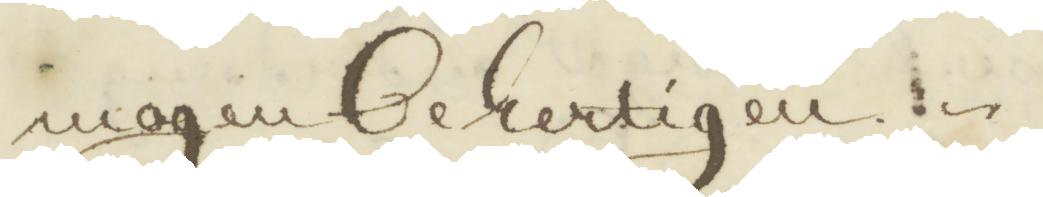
mogen behertigen. —
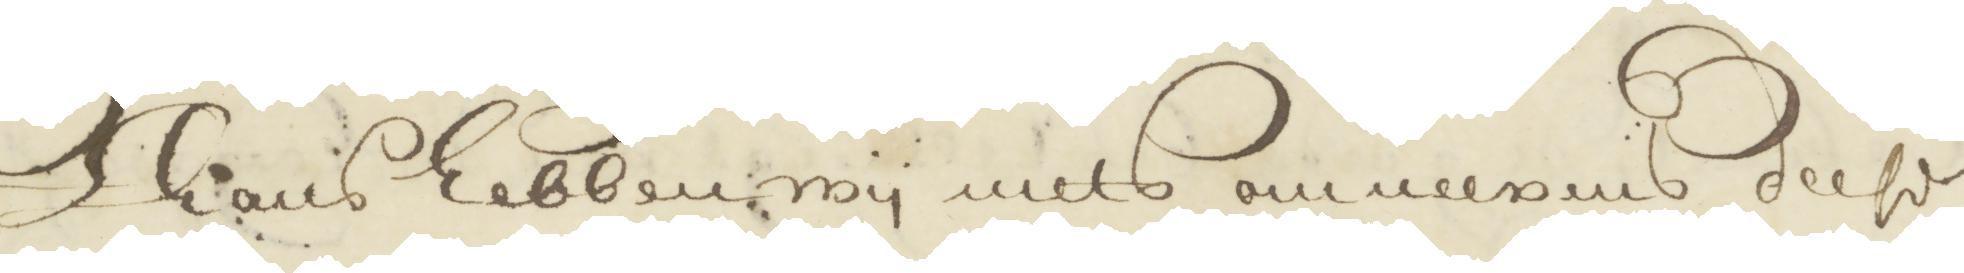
Thans hebben wij niets omneevens deese
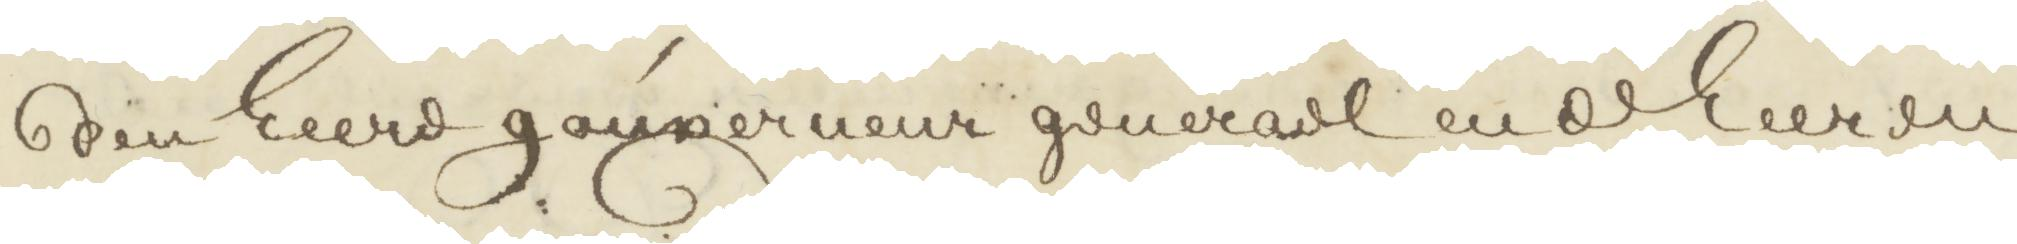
den heere gouverneur generael en de Heeren
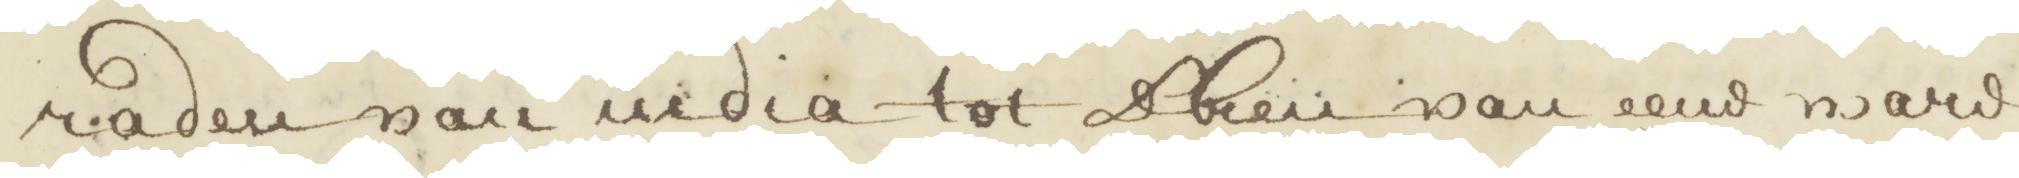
raden van india tot teken van eene ware
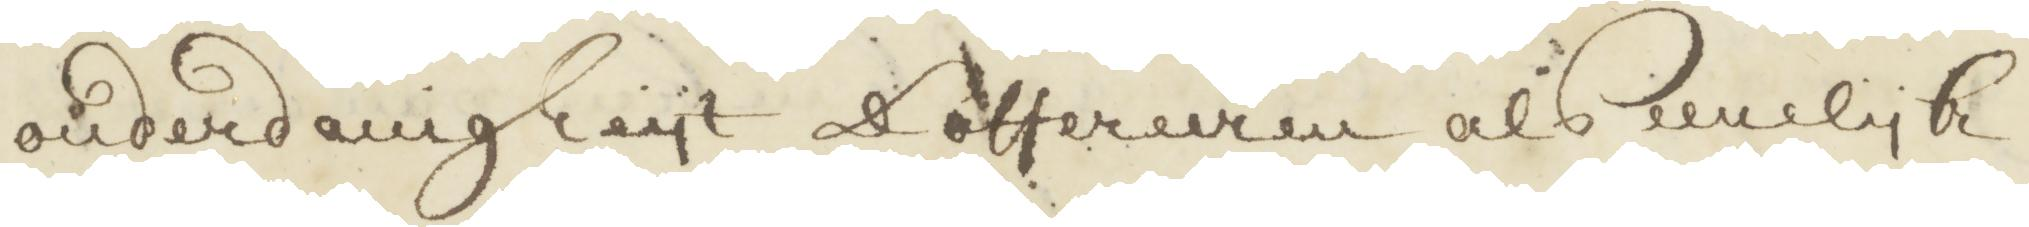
onderdanigheijt te offereeren als eenelijk
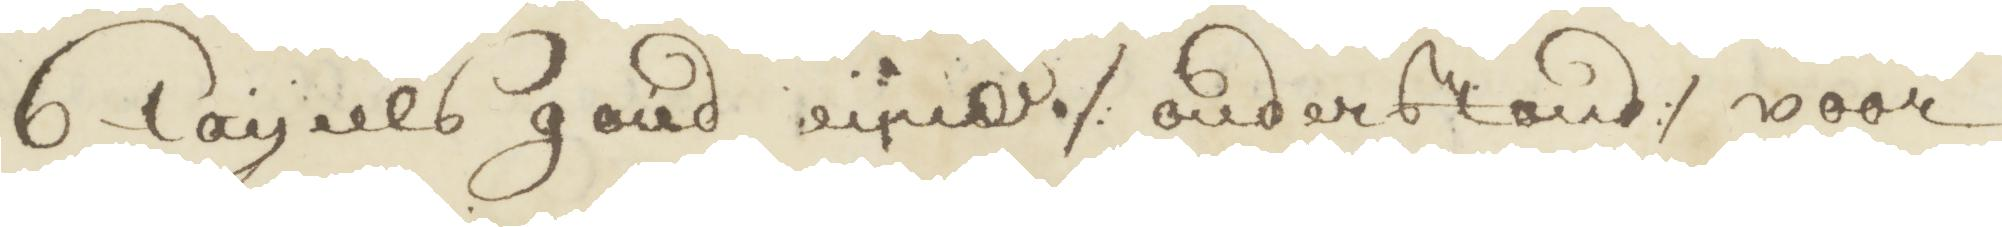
6 taijeels goud eijnde /: onderstond:/ voor
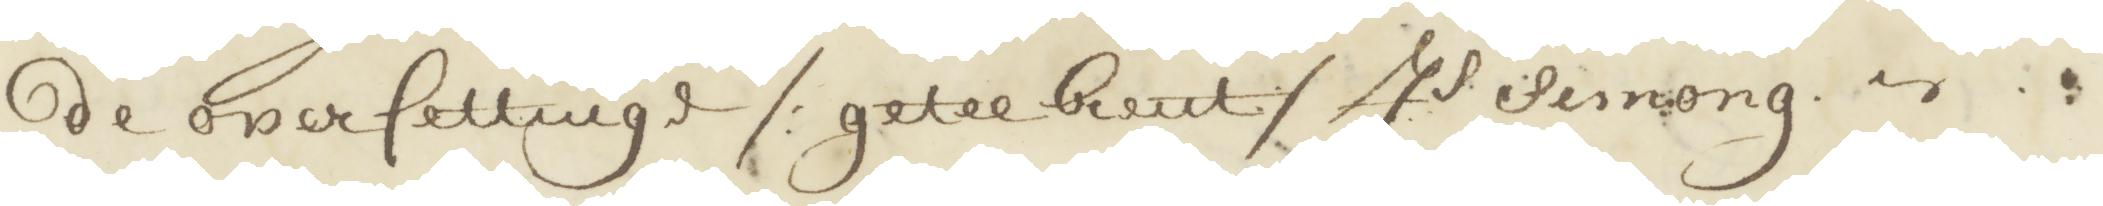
de oversettinge /:geteekent/ Js Simong. —
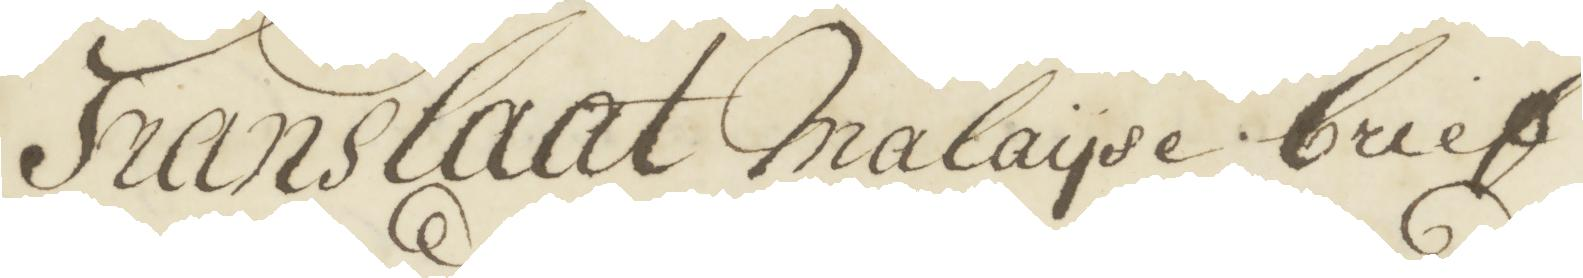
Translaat malaijse brief
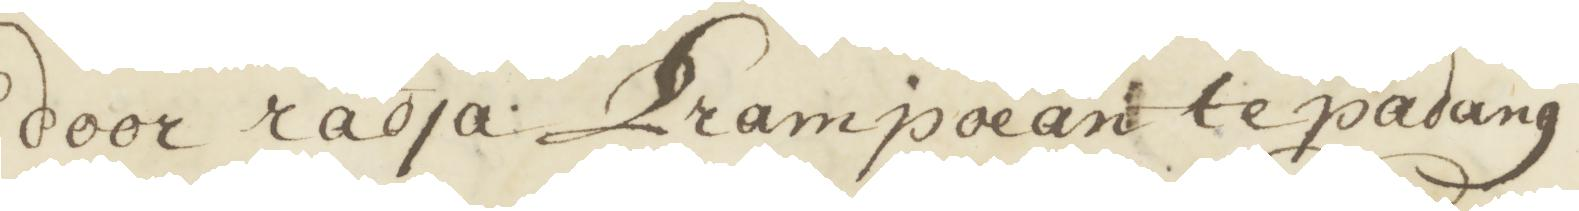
door radja Prampoean te padang
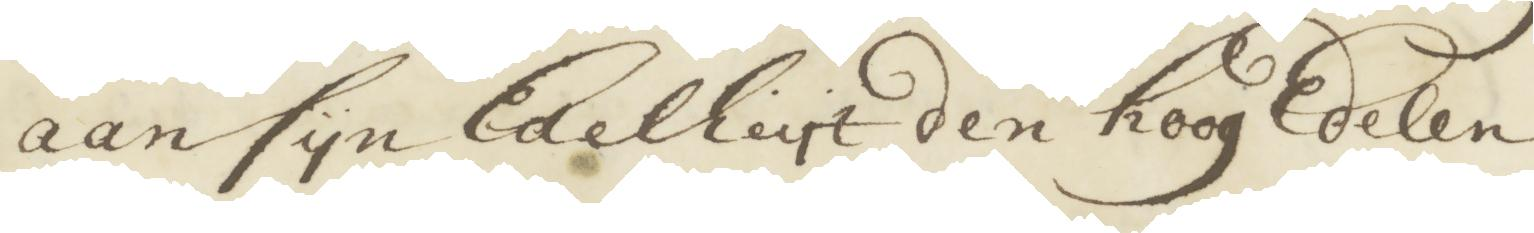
aan sijn Edelheijt den hoogEdelen
